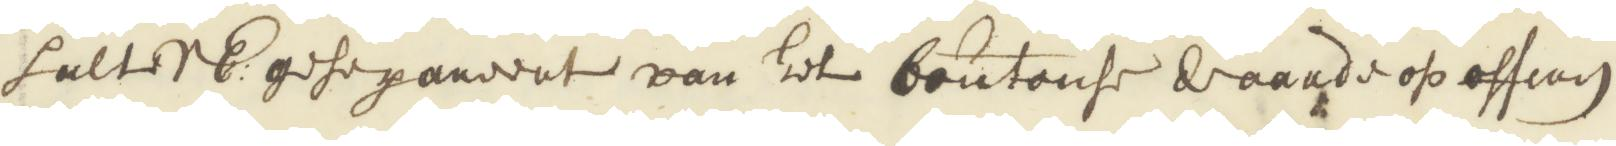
sult VE: gesepareert van het boutonse de aarde op offeren
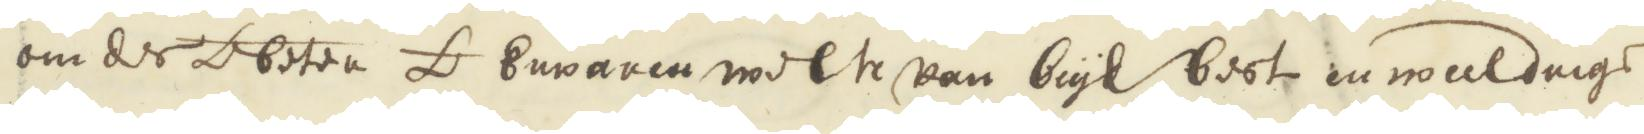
om des te beter te Ervaren welk van beijde best en weeldrige
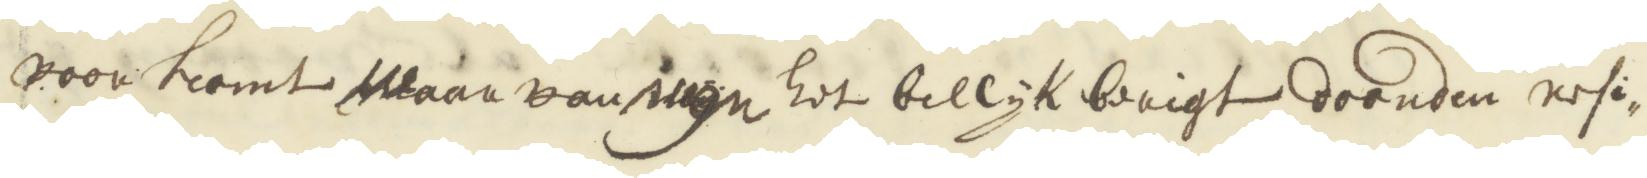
voor komt waar van men het billijk berigt doorden resi„
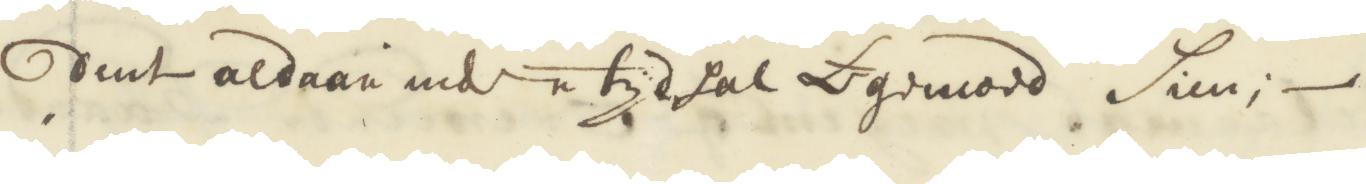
„dent aldaar inder tijd sal te gemoed sien; —
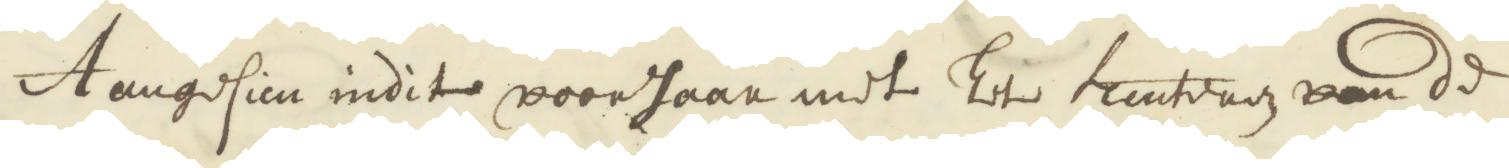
Aangesien indit voor Jaar met het kenteren van de
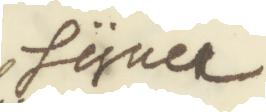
sijner
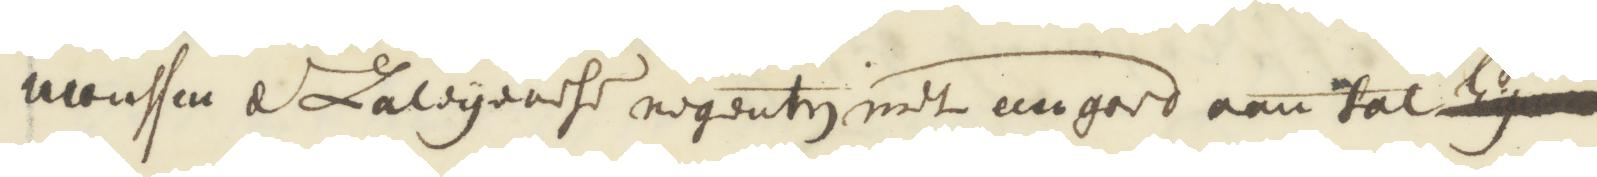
monssen de zaleijerese regenten met een goed aan tal hij
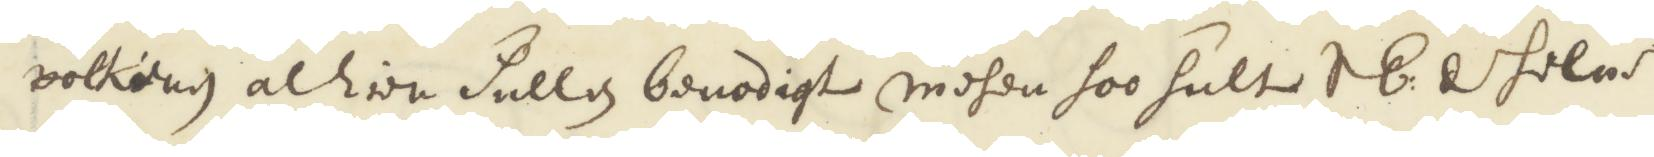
volkeren alhier sullen benodigt wesen soo sult vE: deselve
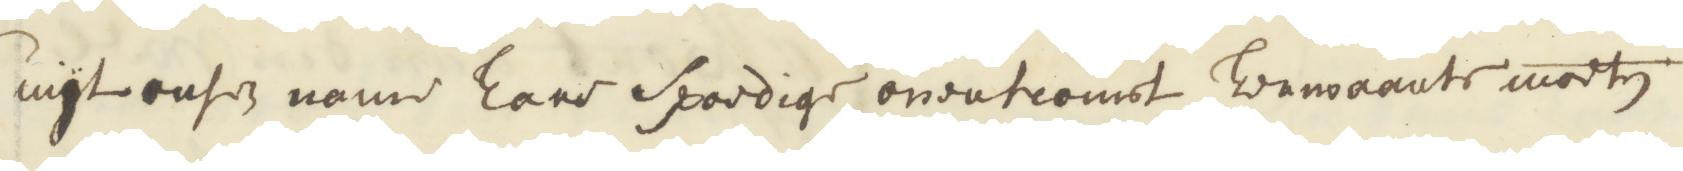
uijt onsen name hare spoedige overkomst herwaarts moeten
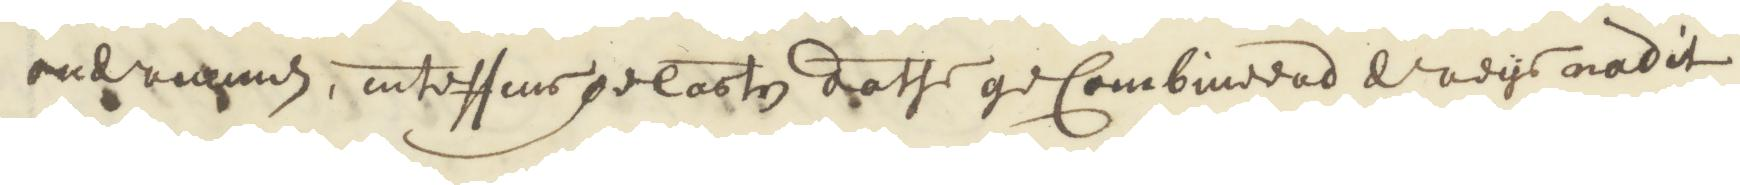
ondernemen, enteffens gelasten datse gecombineerd dereijs nadit
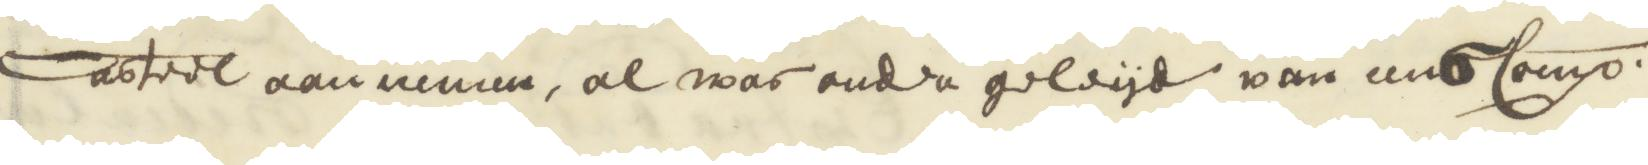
Casteel aan nemen, al was onder geleijde van een sComp:
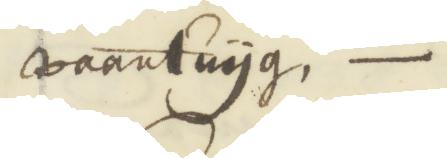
vaartuijg; —
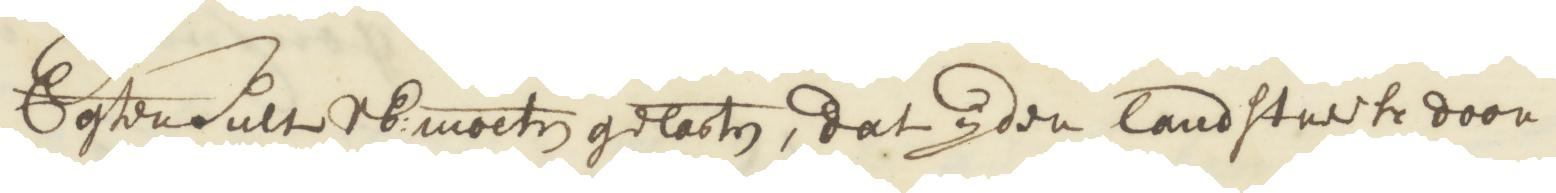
Egter sult VE: moeten gelasten, dat ijder land streek door
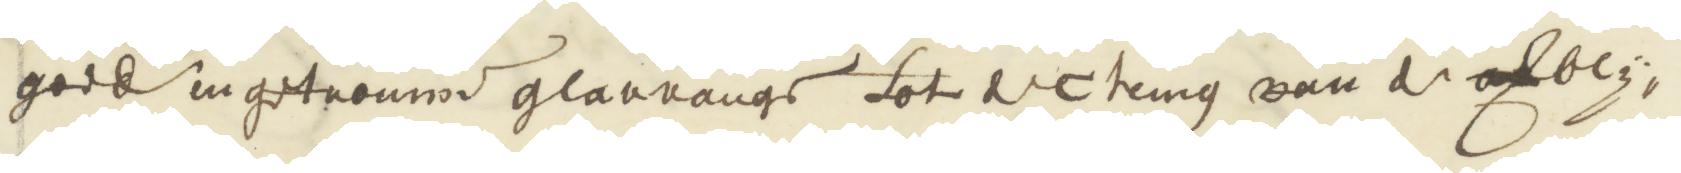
goede in getrouwe glarrangs tot decking van de overblij„
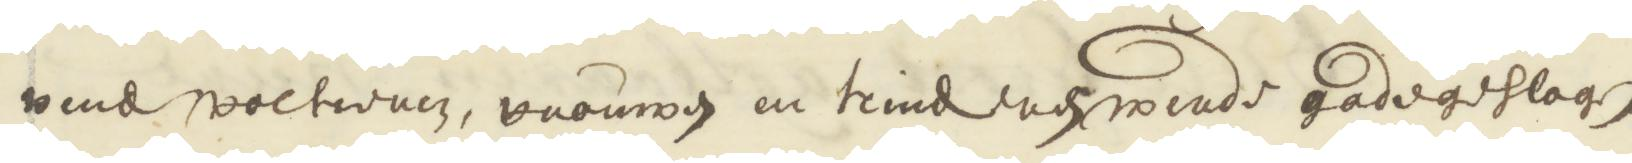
vende volkeren, vrouwen en kinderen werde gadegeslagen
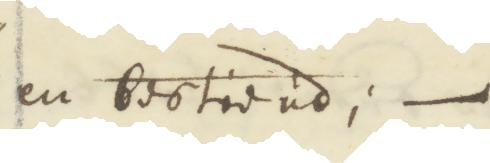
en bestierd; —
